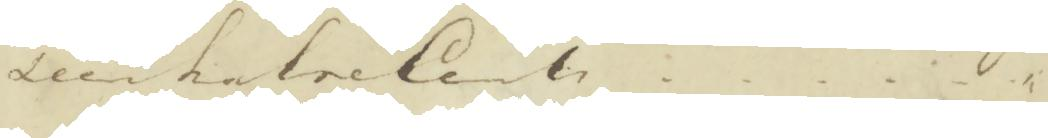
& een halve Cents - - - - - „
